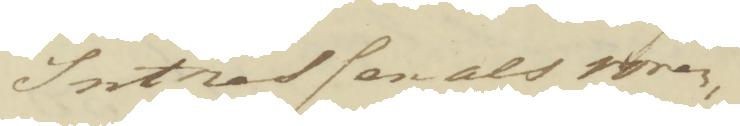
Intressen als voren,
